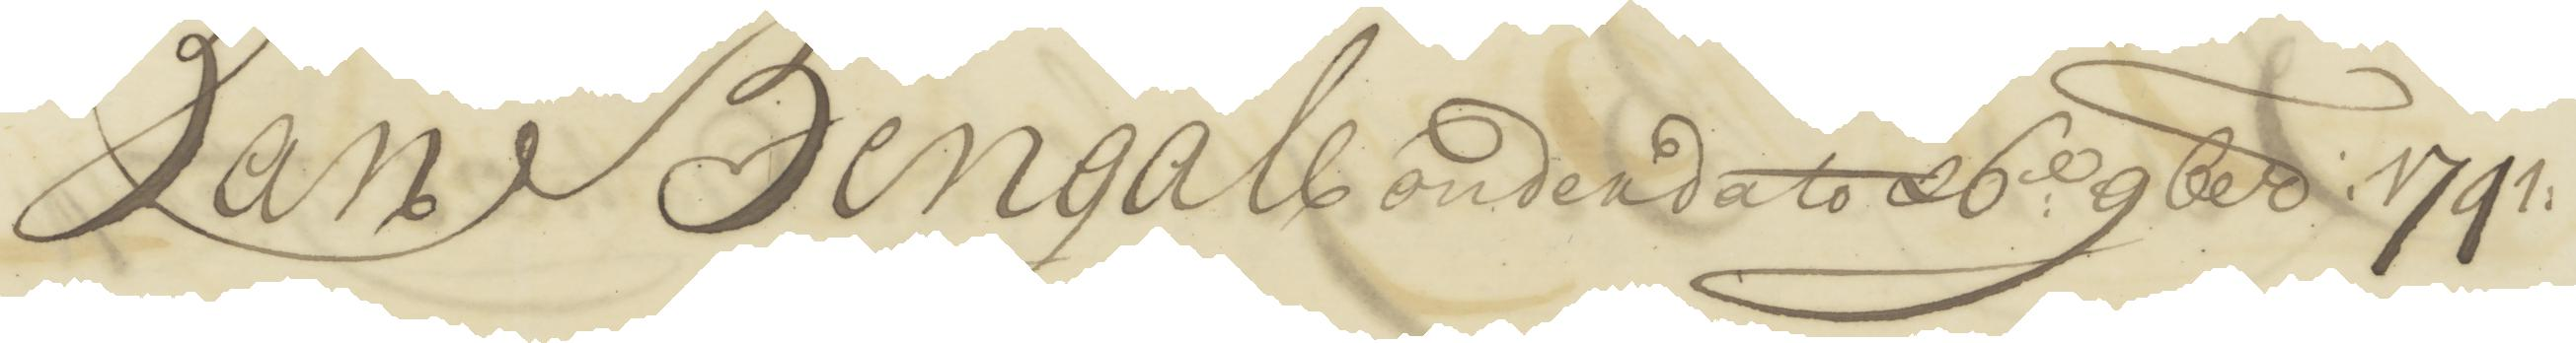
Van Bengale onder dato 26:' 9ber: 1741:
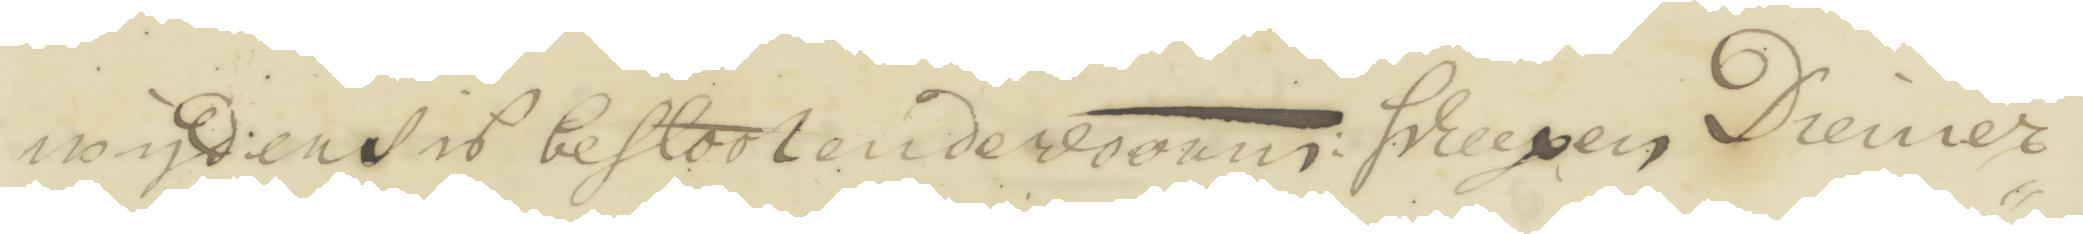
wijders is beslooten de voorm: scheepen Diemer„
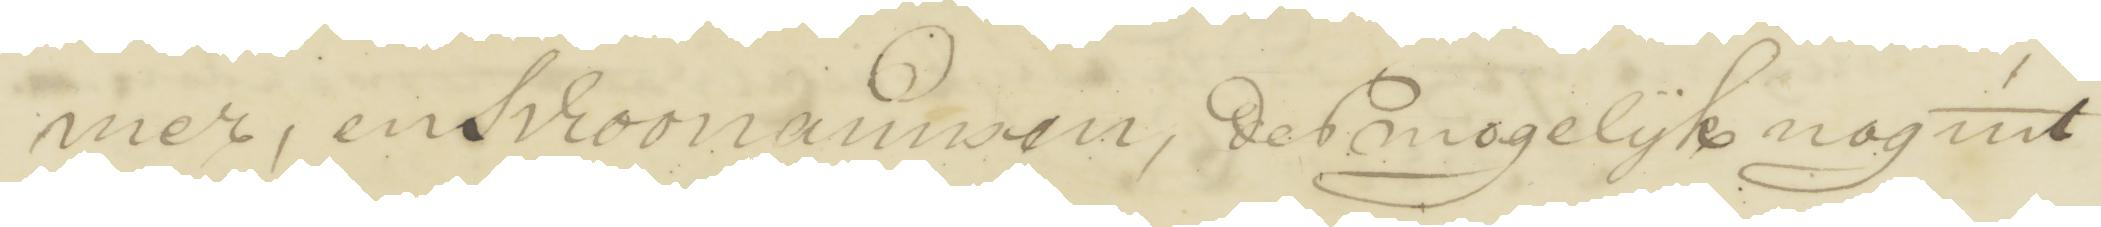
mer, en schoonauwen, des mogelijk nog int
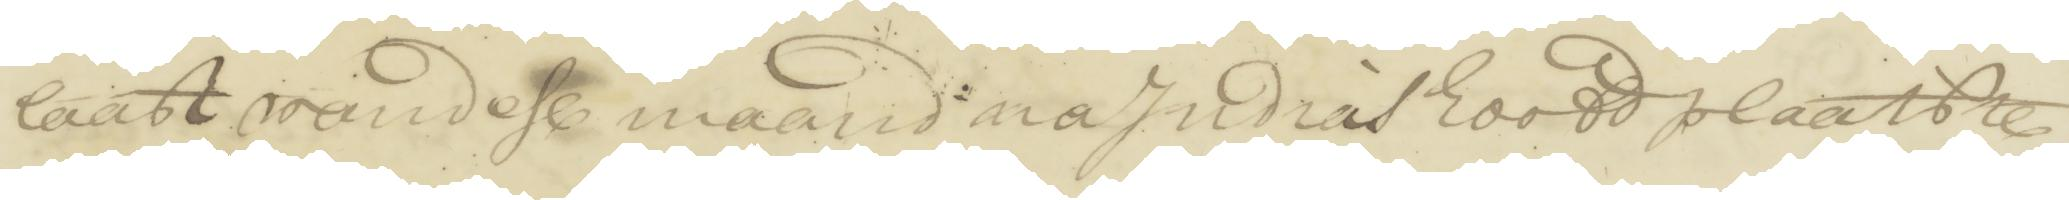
laast van dese maand na Jndias hoofdplaats te
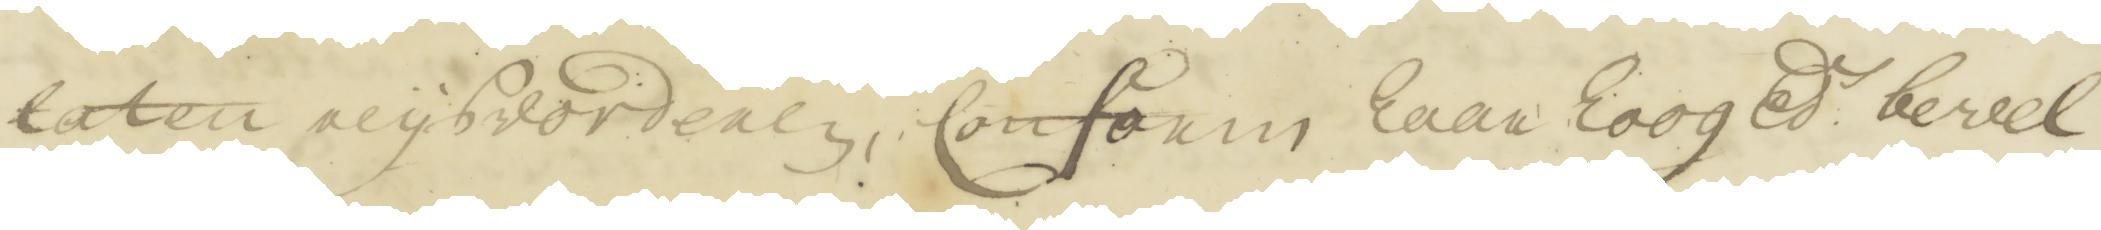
laten reijsvorderen, conform haar hoog Ed:s bevel
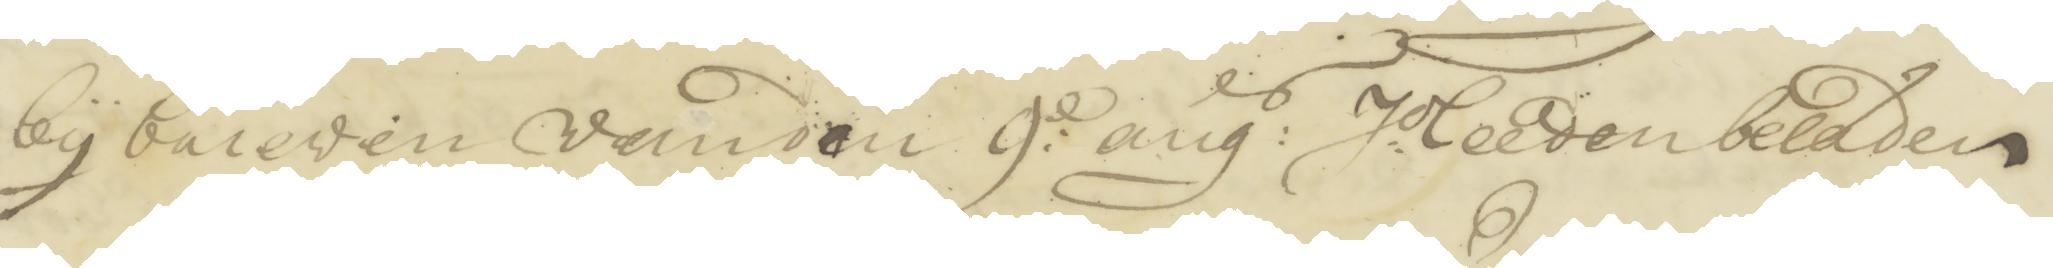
bij brieven van den 9:' aug:s J=oleeden beladen
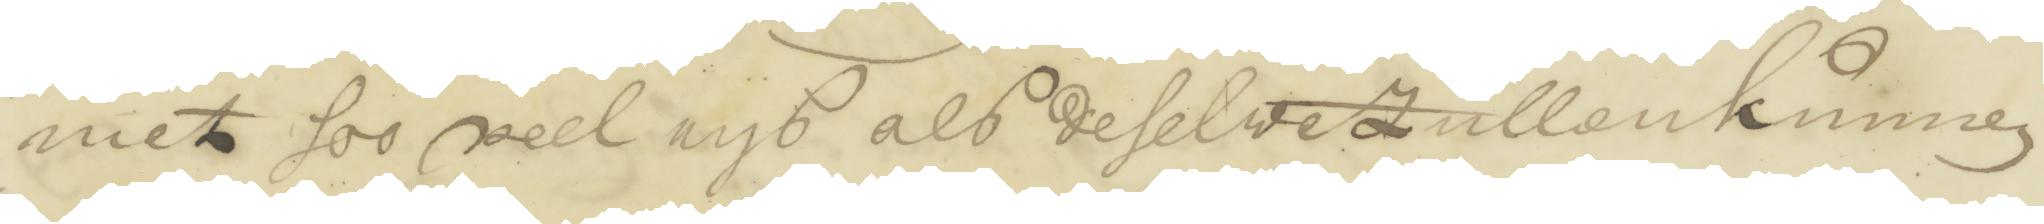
met soo veel rijs als deselve zullen kunnen
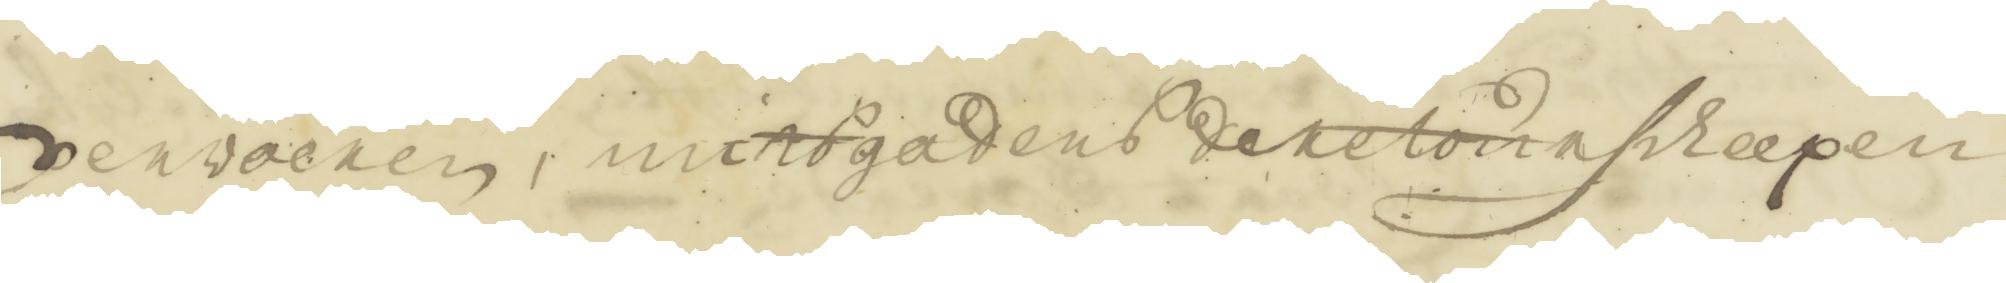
vervoeren, mitsgaders de retourscheepen
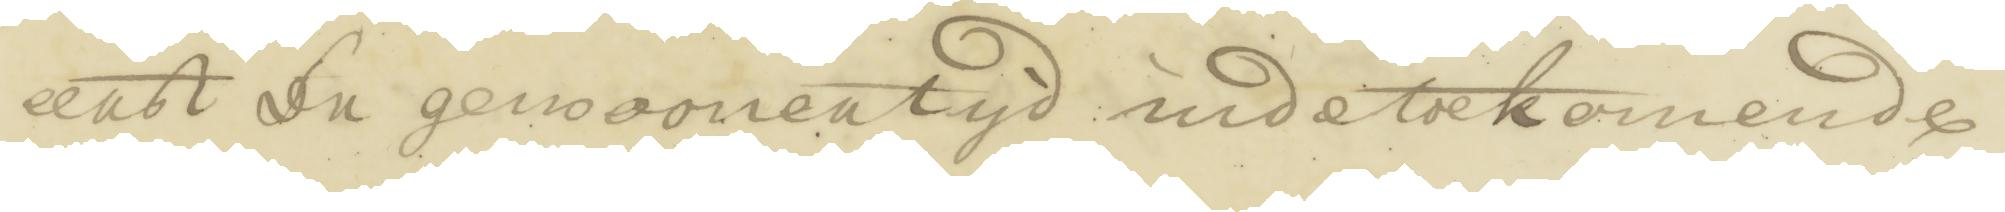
eerst ter gewooner tijd inde toekomende
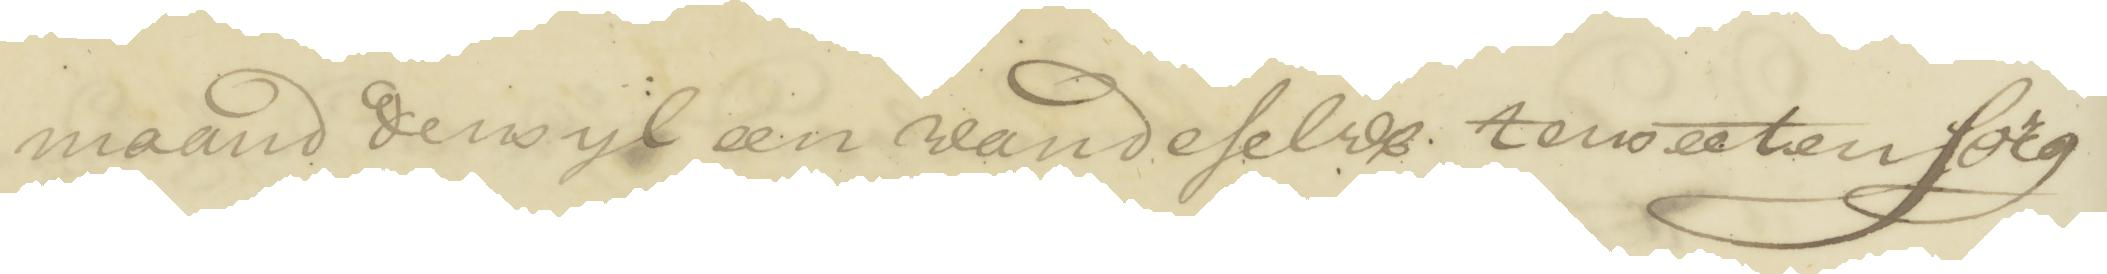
maand dewijl een van deselve teweeten sorg
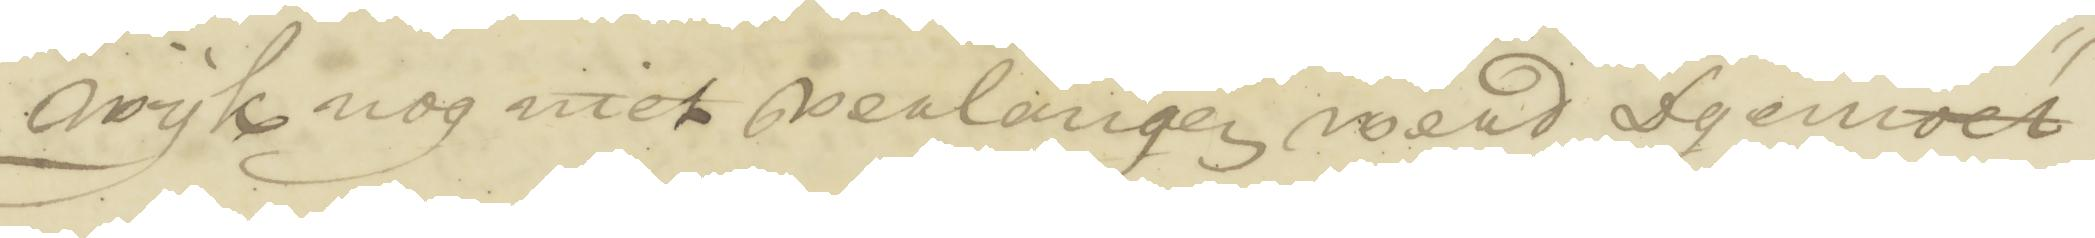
wijk nog met verlangen werd tegemoet
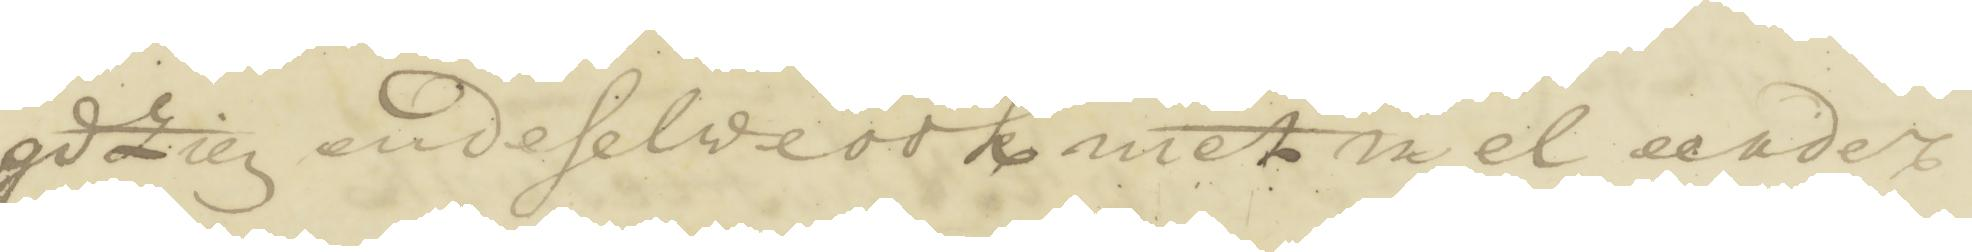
gezien en deselve ook niet wel eerder
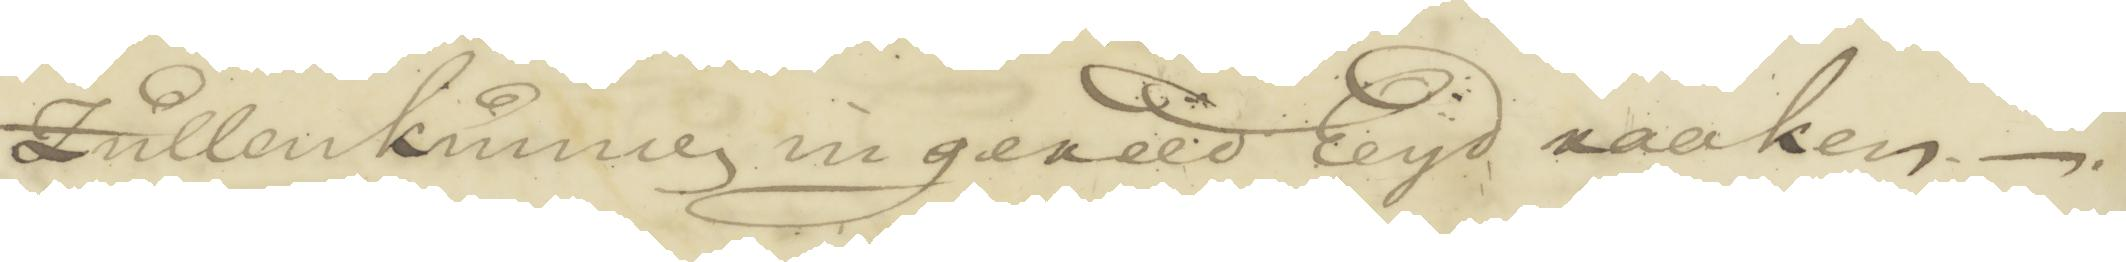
zullen kunnen in gereed heijd raaken.—.
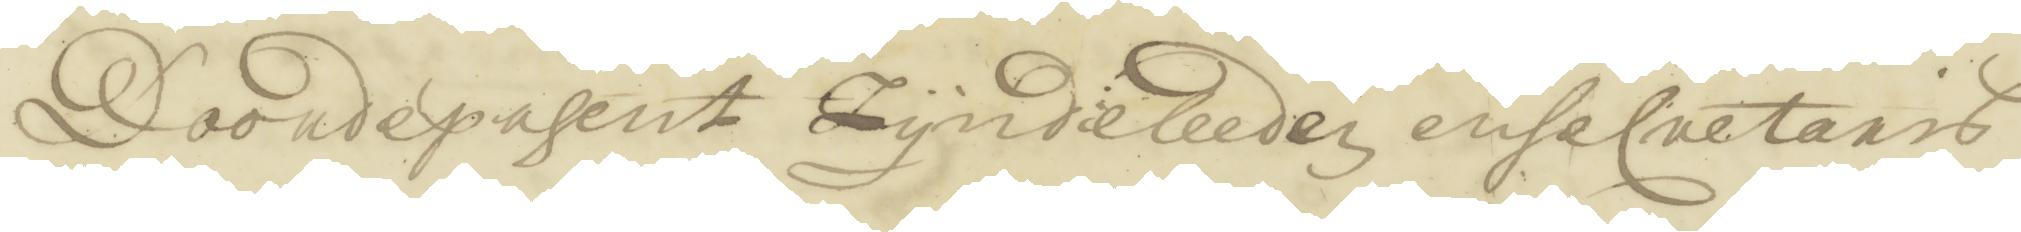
Doordepresent zijnde leeden ensecretaris
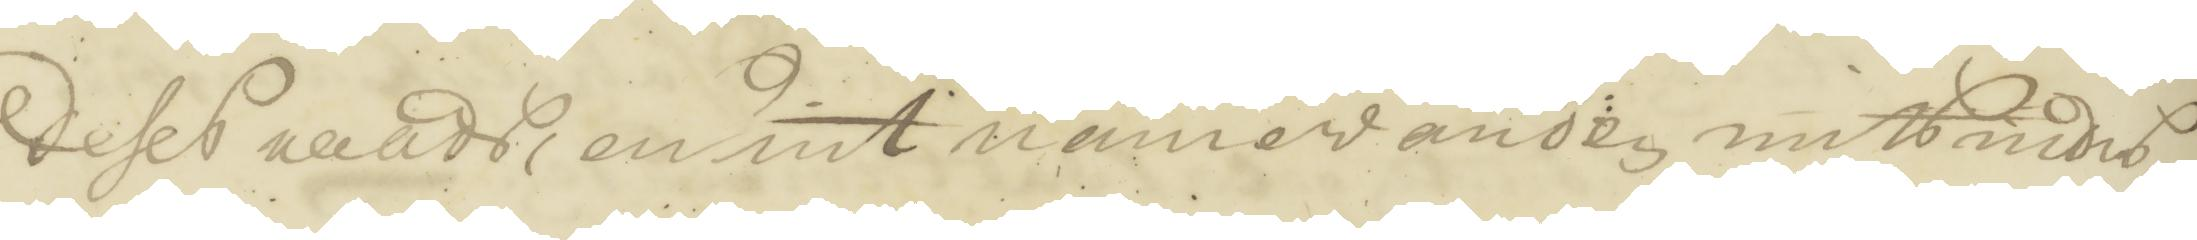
deses raads, en in't name vanden mits indis
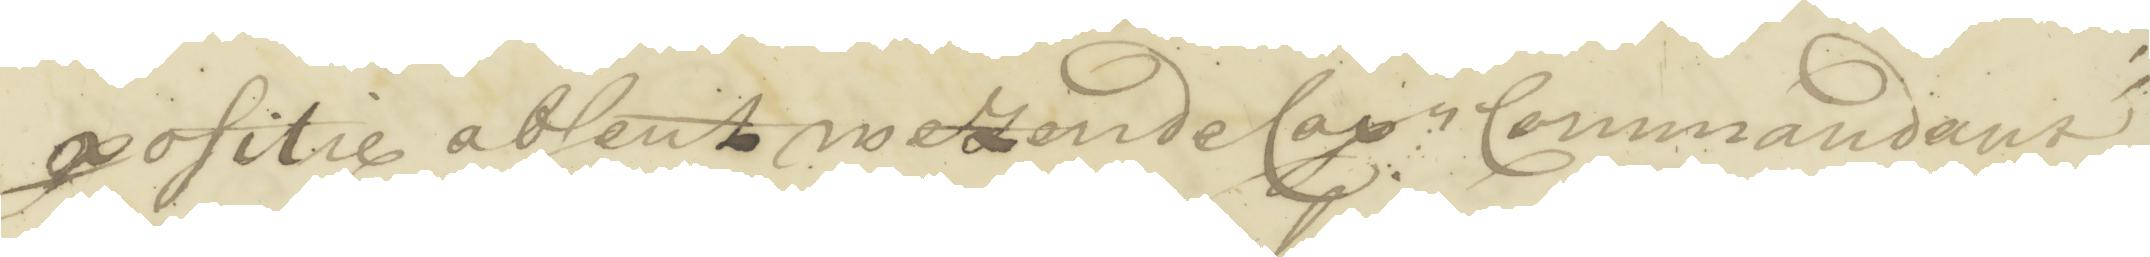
positie absent wezende Cap:n Commandant
